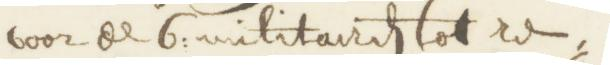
voor de 6. militairen tot re„
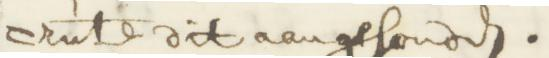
crute dit aangesonden.
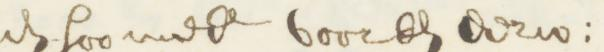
en soo mede voor den eerw:
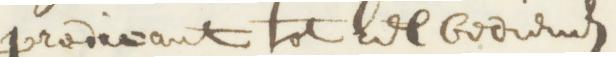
predicant tot het bedienen
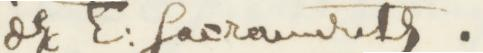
der h: sacramenten.
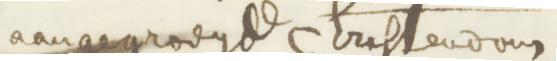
aangegroeijde christendom
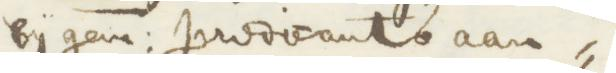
bij gem: predicants aan„
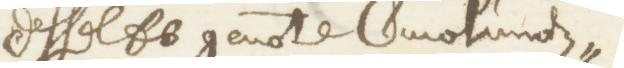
desselfs genote Emolumen„
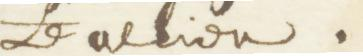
te alhier.
